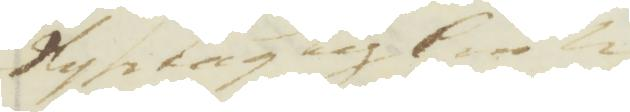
Vijftagtig Cents
